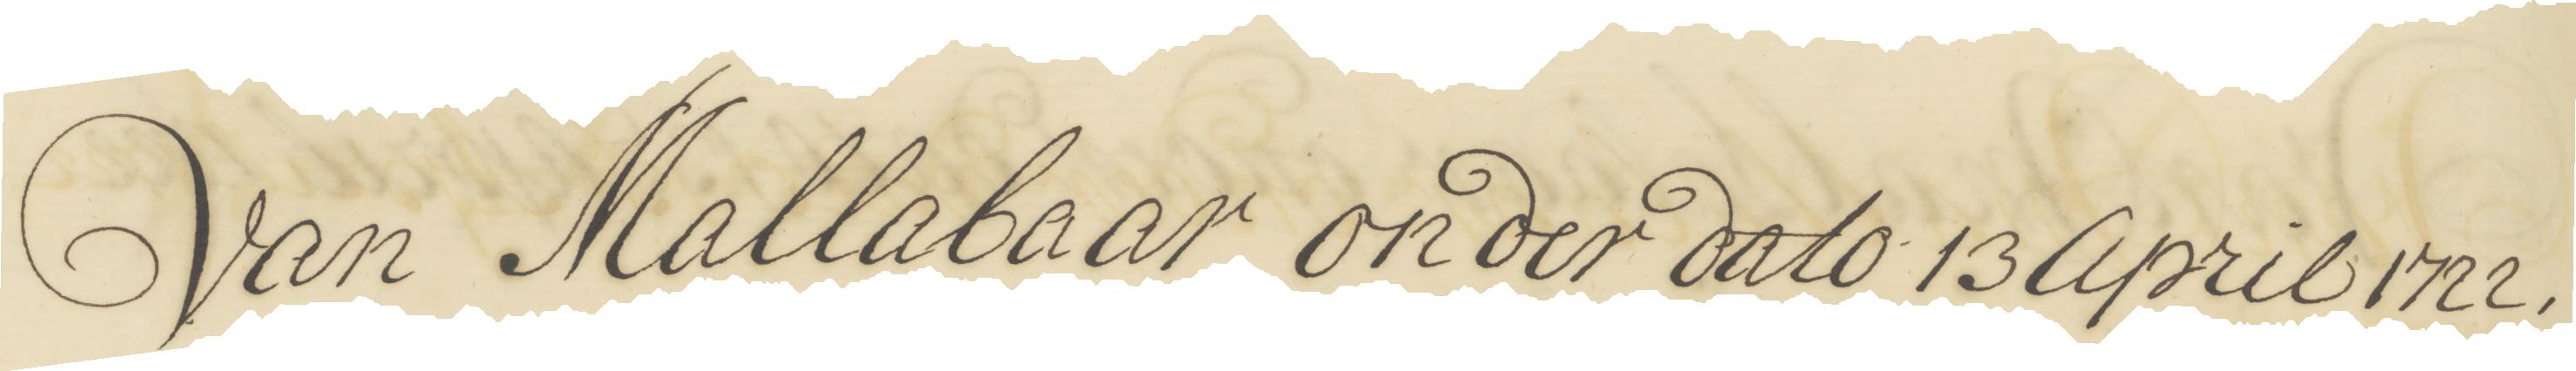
Van Mallabaar onder dato 13 April 1722,
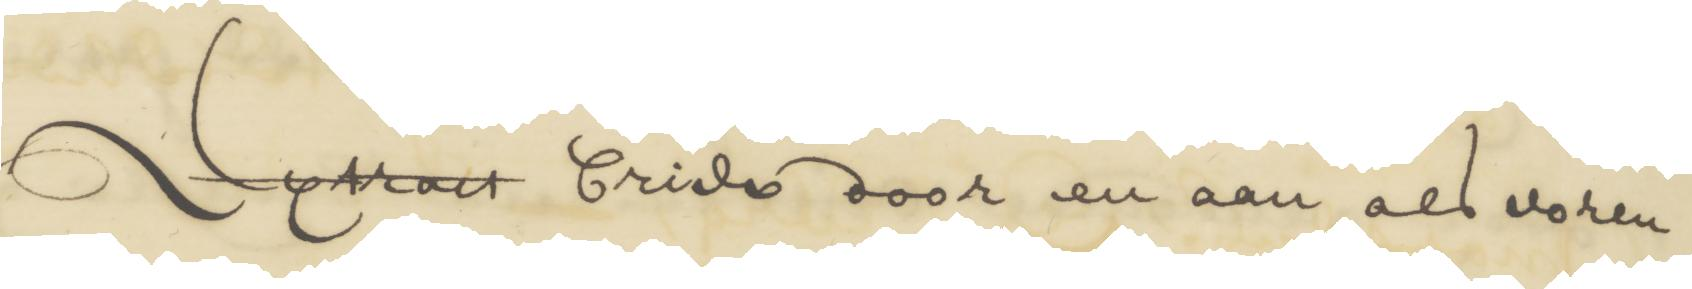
Extract briev door en aan als voren
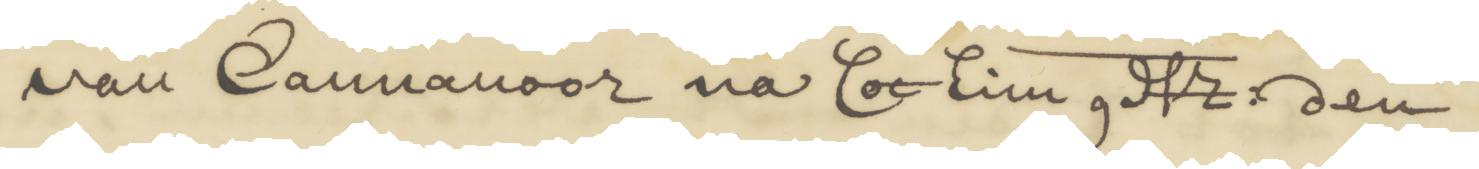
van Cannanoor na Cochim gesz: den
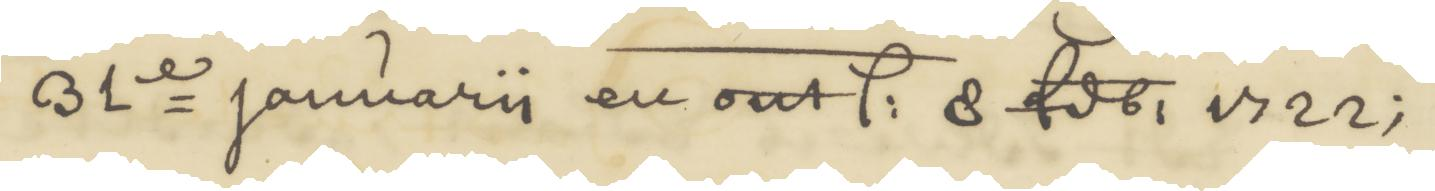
31=e januarij en ontf: 8 feb: 1722;
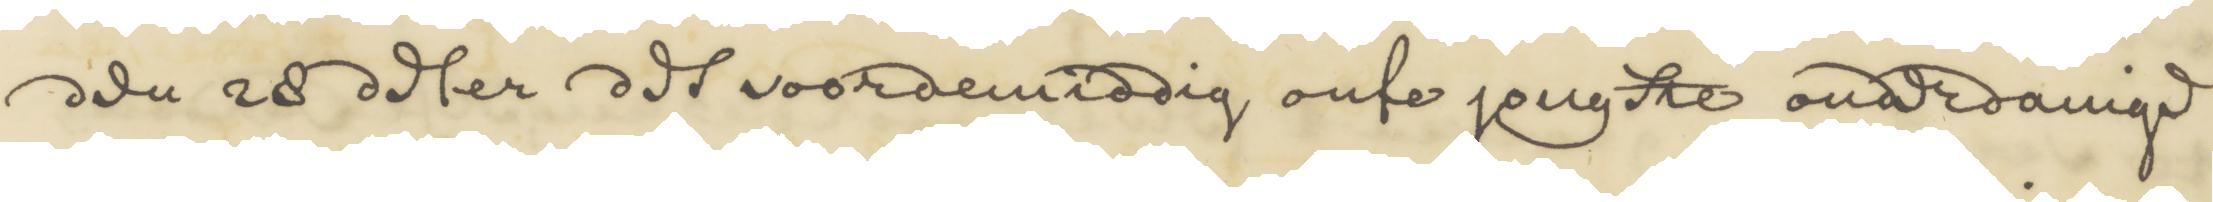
den 28 deser des voordemiddig onse jongste onderdanige
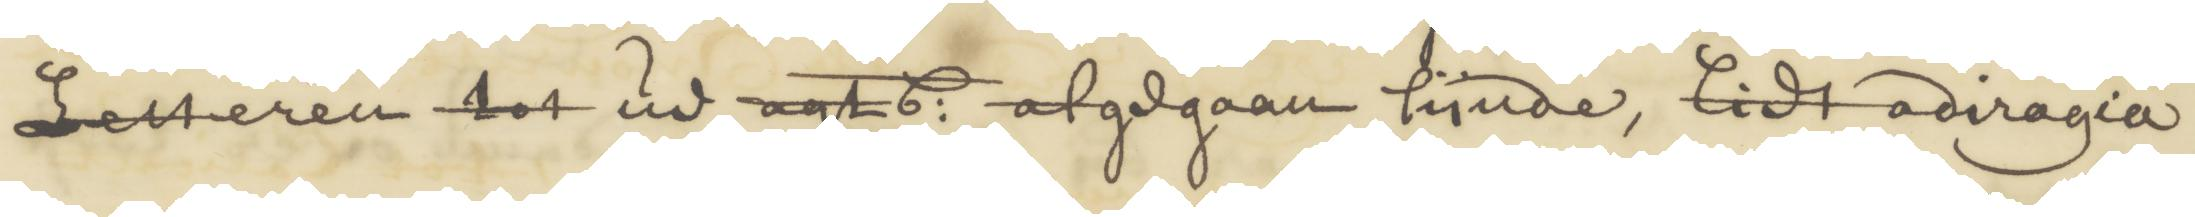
Letteren tot ue agtb: afgegaan sijnde, liet adiragia
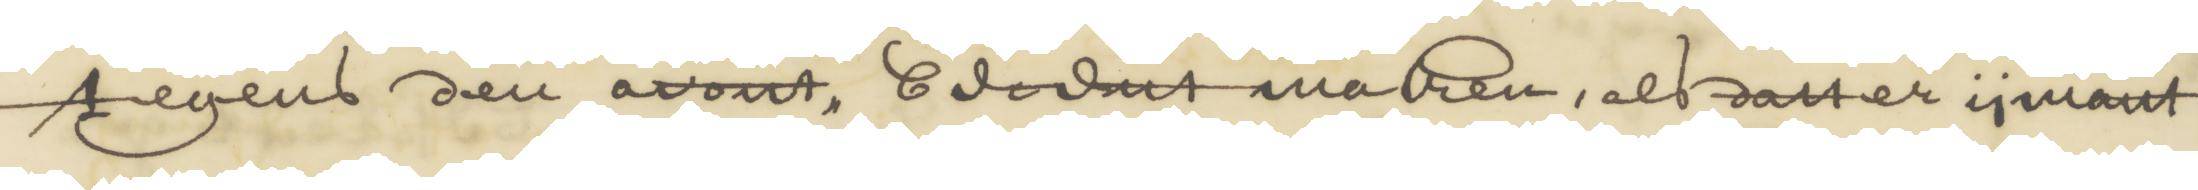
tegens den avont„ becent maken, als datter ijmant
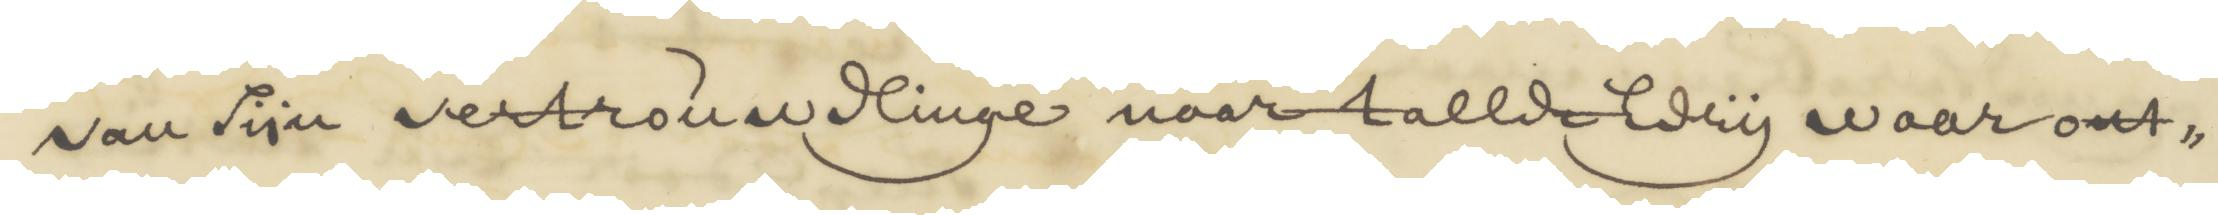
van sijn vertrouwelinge naar tallecherij waar ont„
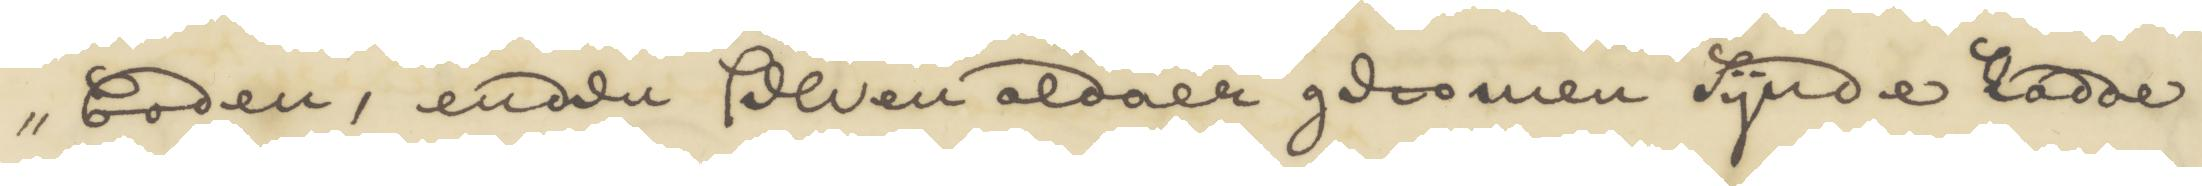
„boden, enden selven aldaer gecomen sijnde hadde
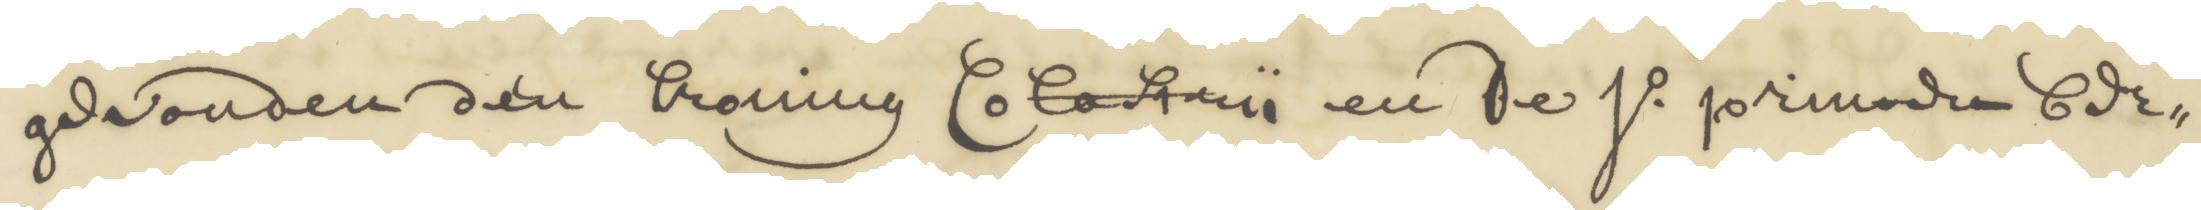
gevonden den koning Colostrij en de j.o primen ber„
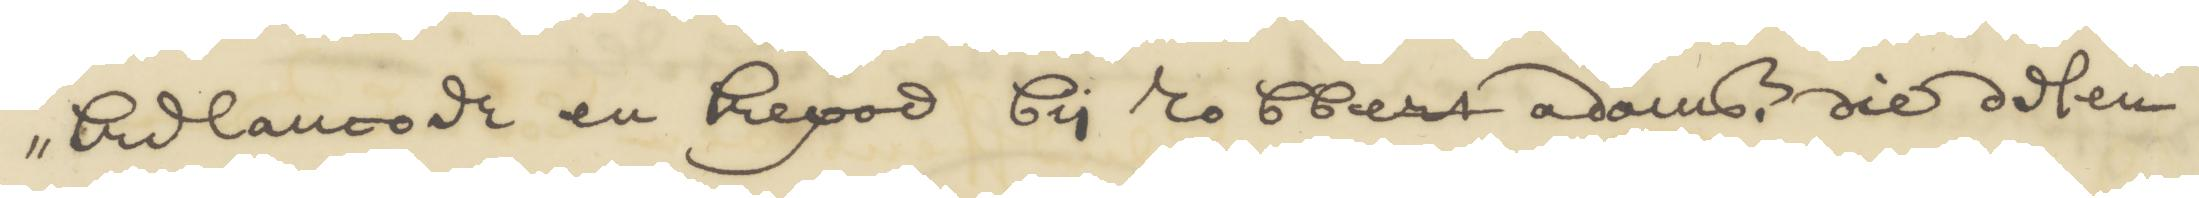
„kelancoer en kepod bij robbert adams, die desen
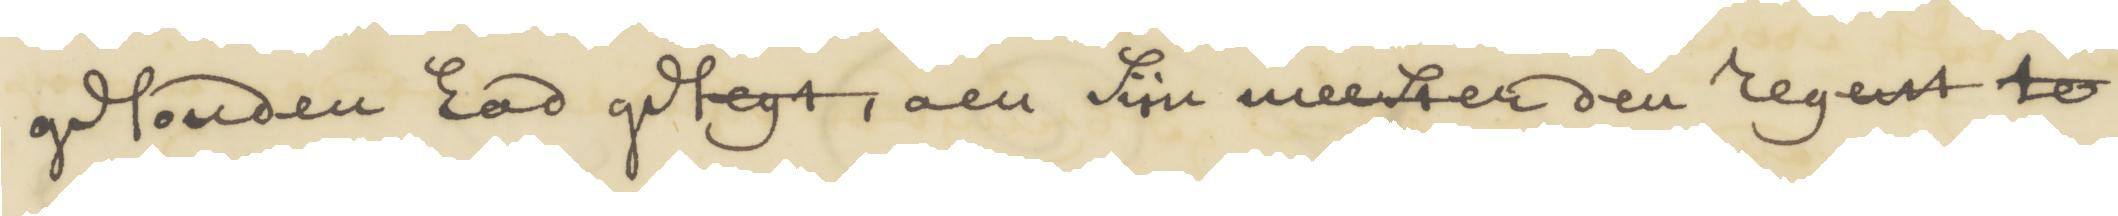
gesonden had gesegt, aen sijn meester den regent te
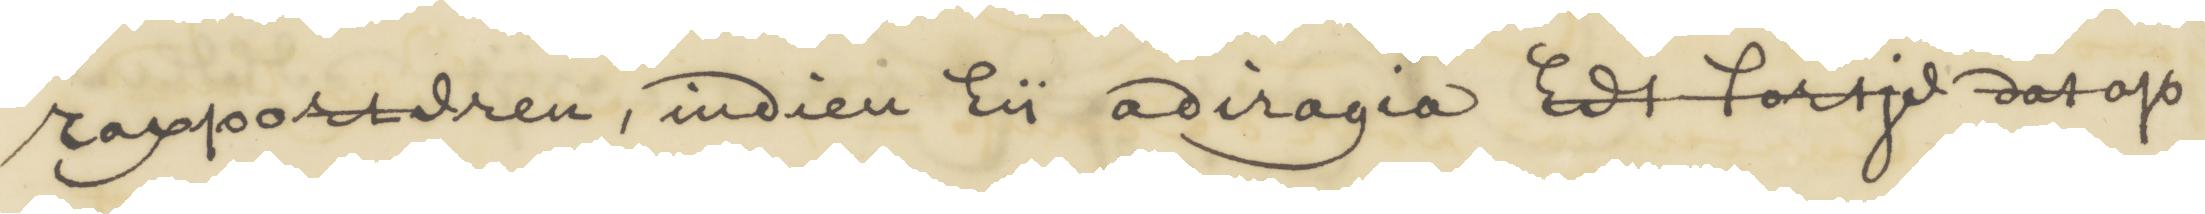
rapporteren, indien hij adiragia het fortje dat op
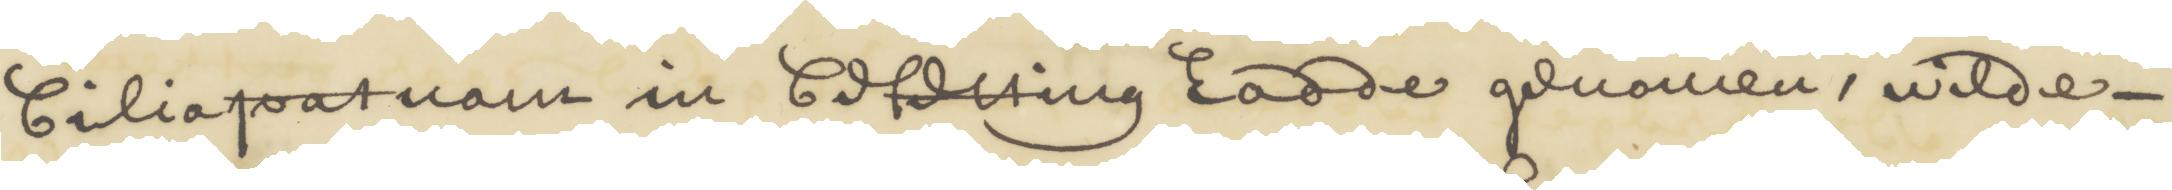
biliapatnam in besetting hadde genomen, wilde –
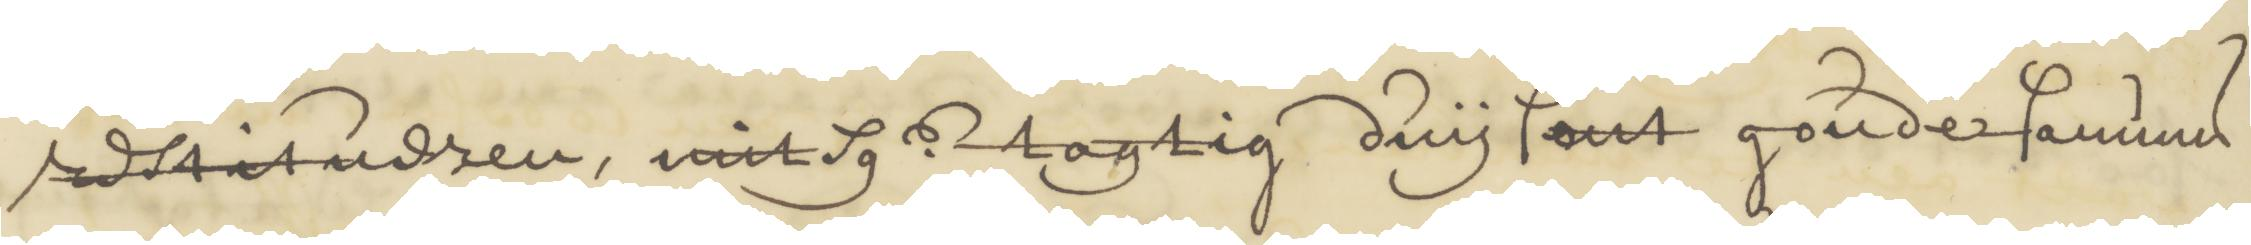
restitueren, mitsg.s tagtig duijsent goude fanums
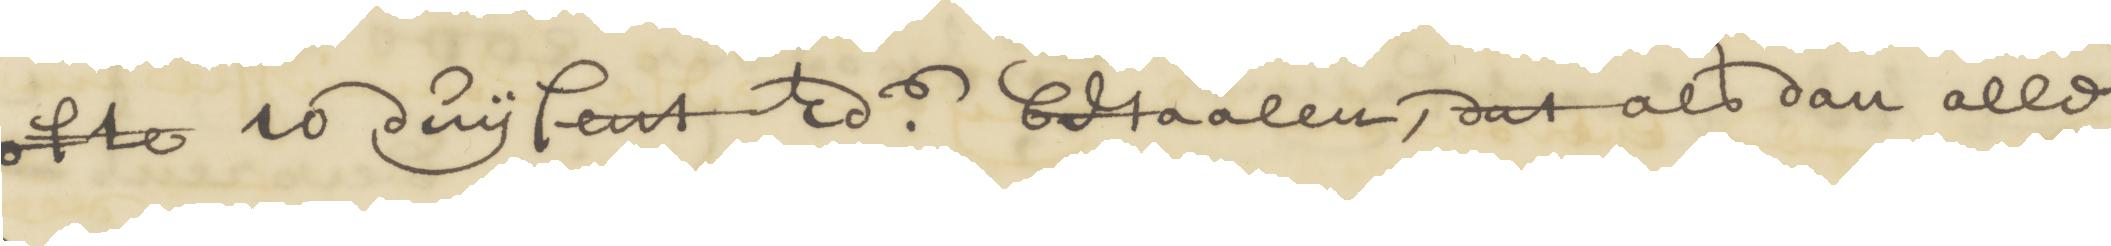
ofte 10 duijsent rd.s betaalen, dat als dan alle
